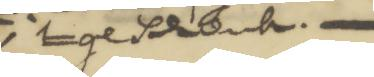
’t geschenk.
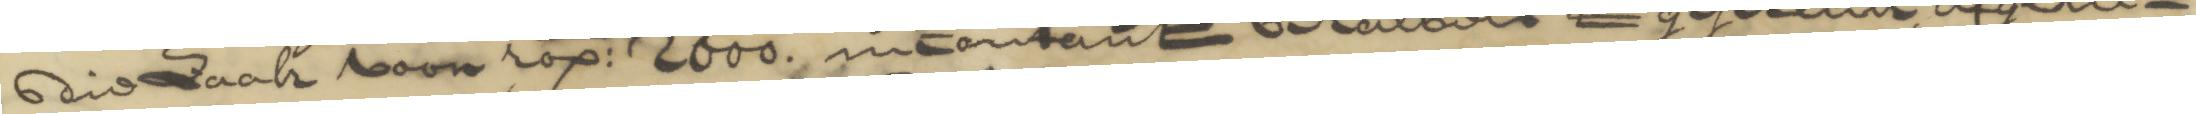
die zaak voor rop: 2000. incontant behalven ’t geschenk afgem=t.
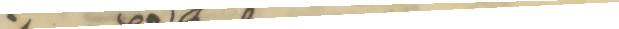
2000. afgemaakt behalven
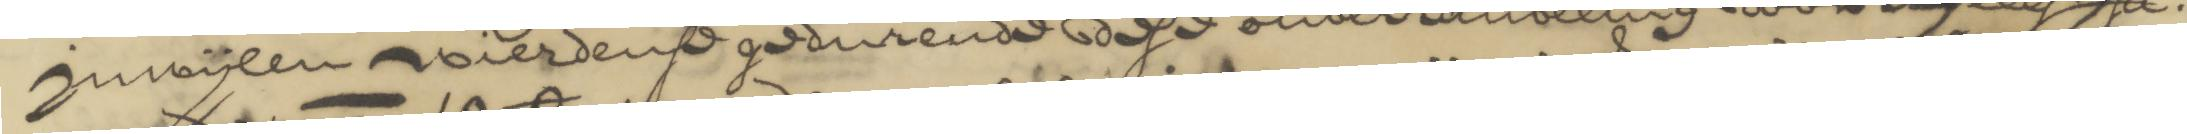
jnwijlen wierden se gedurende dese onderhandeling door sjeeg jsa.
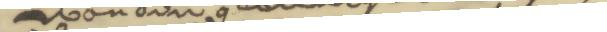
worden gedurigh om sjeeg
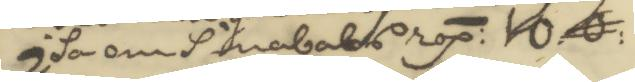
jsa om s' nababs rop: 10. Ø:
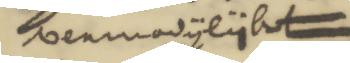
vermoeijlijkt.
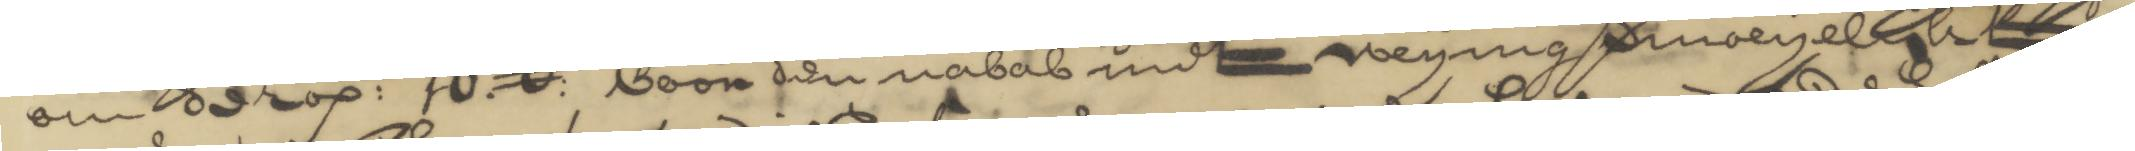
om de rop: 10. Ø: voor den nabab niet weijnig vemoeijelijkt
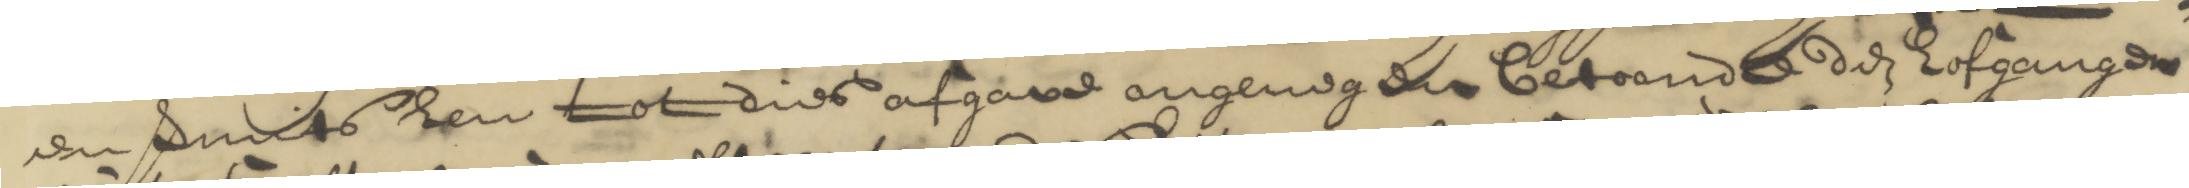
en vermits hen tot dies afgave ongenegen betoonde den hofganger
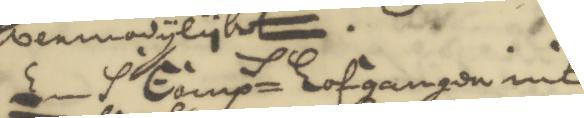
En 's Comp=s hofganger in’t
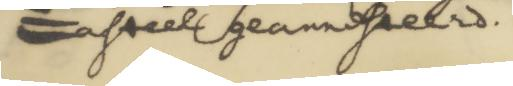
Casteel gearresteerd.
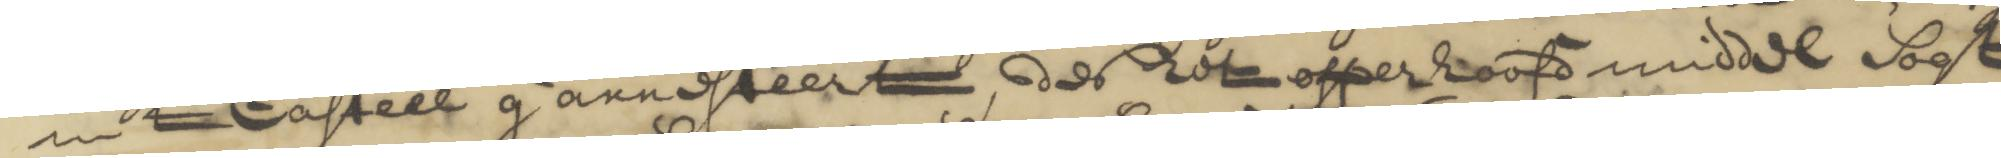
in’t Casteel g’arresteert, des het opperhoofd middel sogt
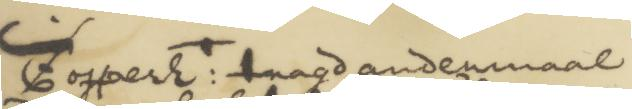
'T opperh:t tragd andermaal
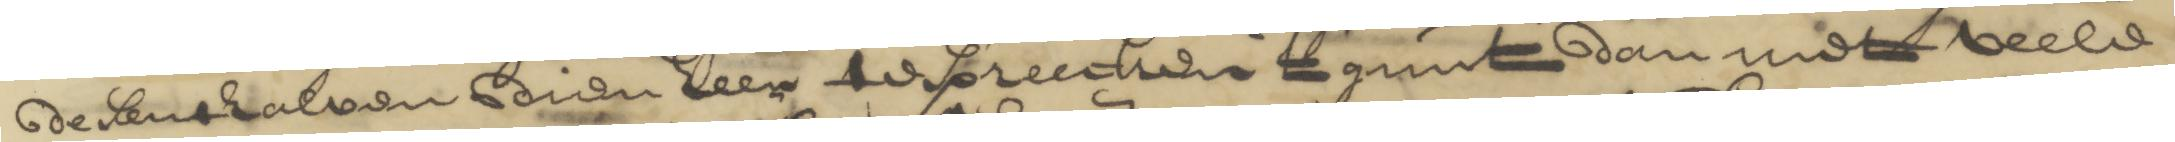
de senthalven dien heer te spreecken 't gunt dan niet veele
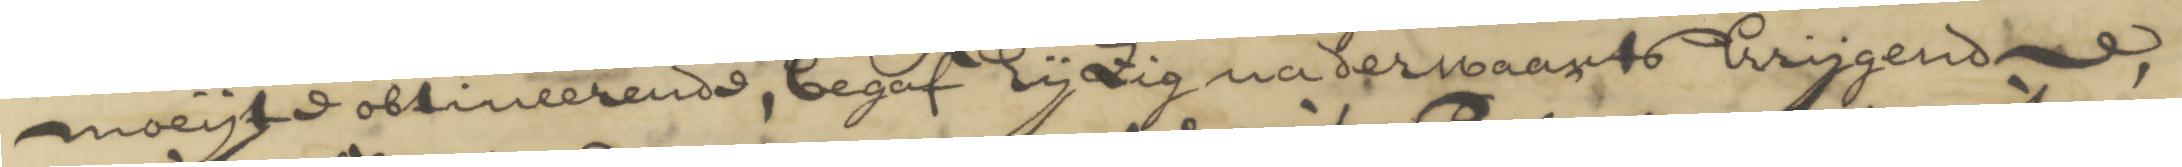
moeijte obtineerende, begaf hij zig na derwaarts krijgende,
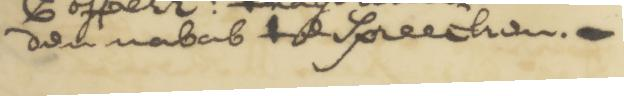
den nababs te spreecken.
